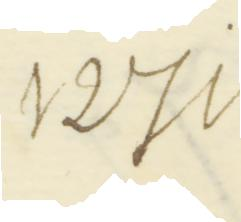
1271
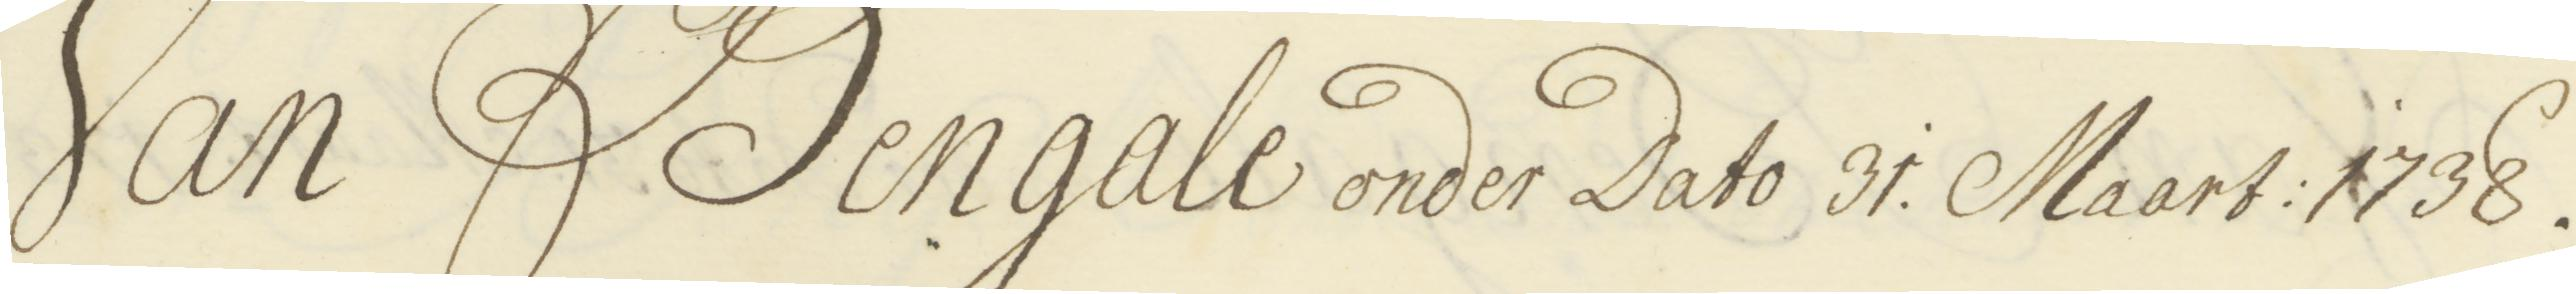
Van Bengale onder dato 31. Maart: 1738.
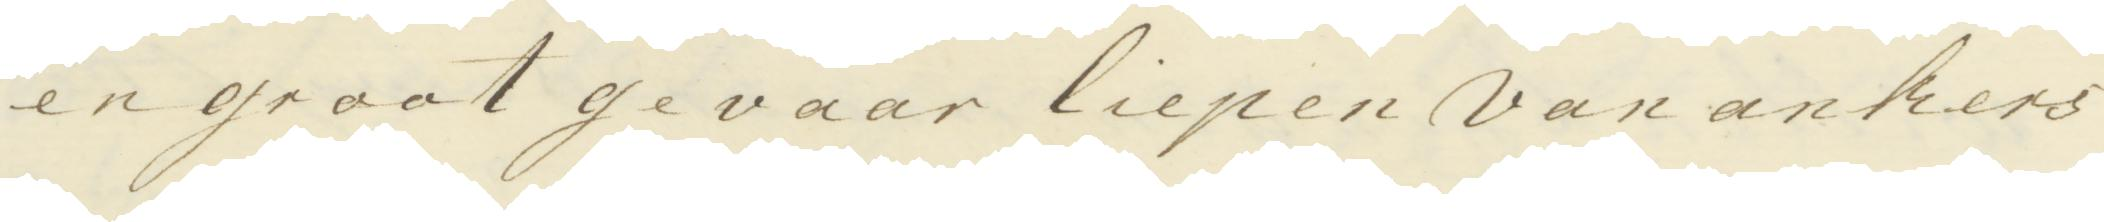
en groot gevaar liepen van ankers
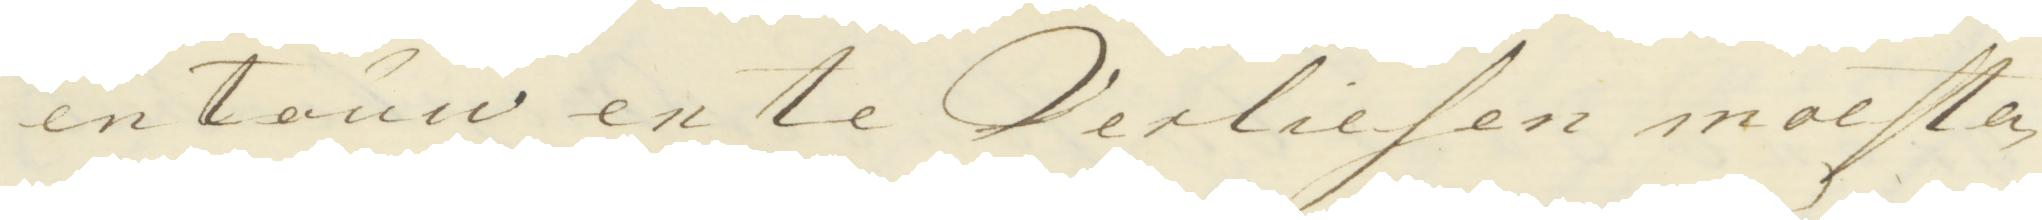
en touw en te verliesen moesten
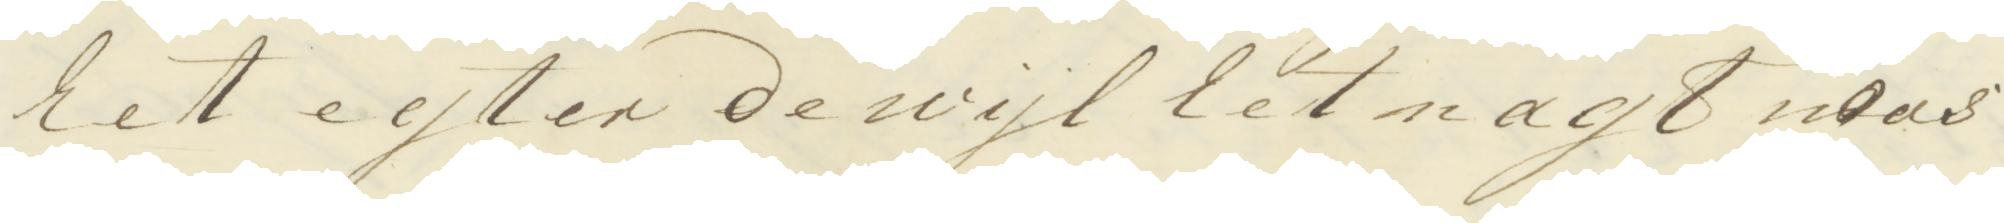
het egter dewijl het nagt was
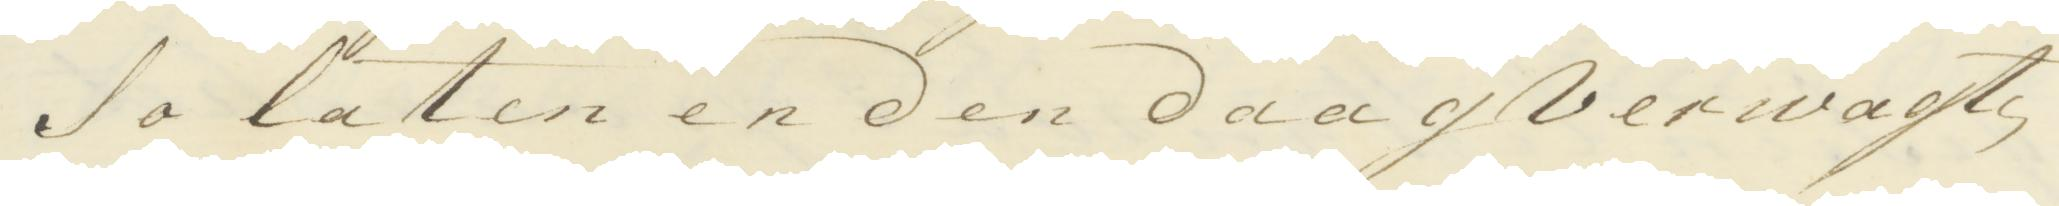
so laten en den daag verwagten
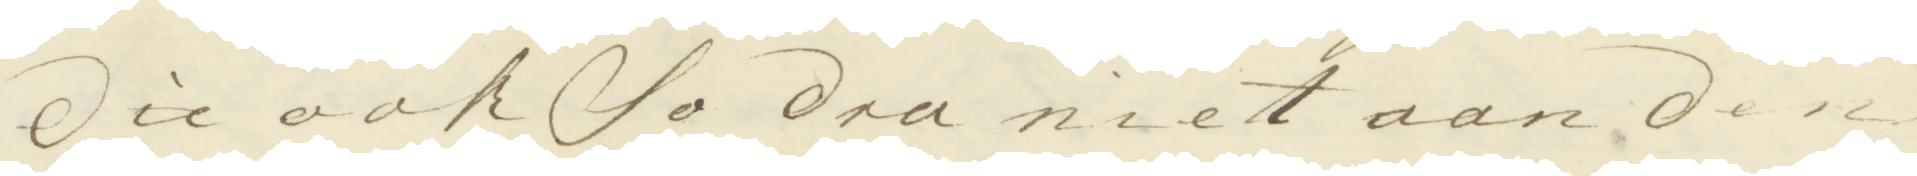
die ook so dra niet aan den
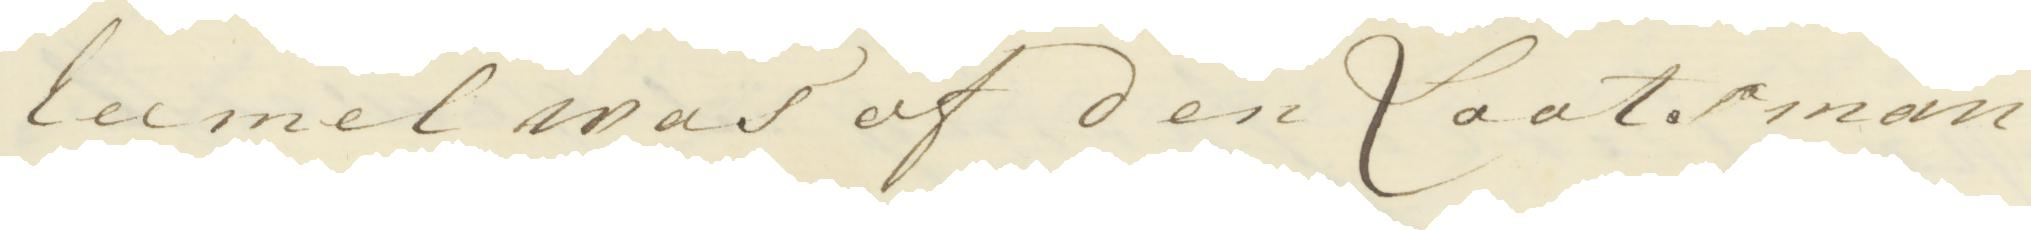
heemel was of den Lootsman
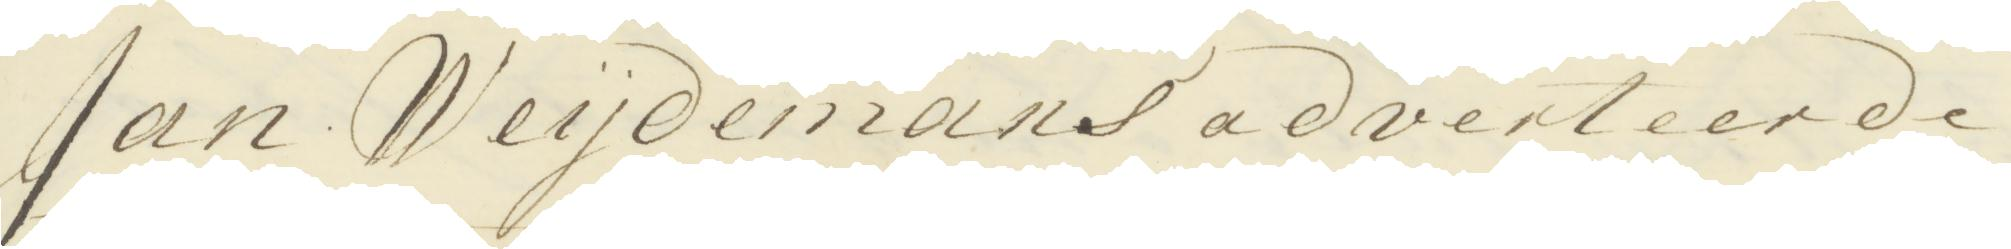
Jan Weijdemans adverteerde
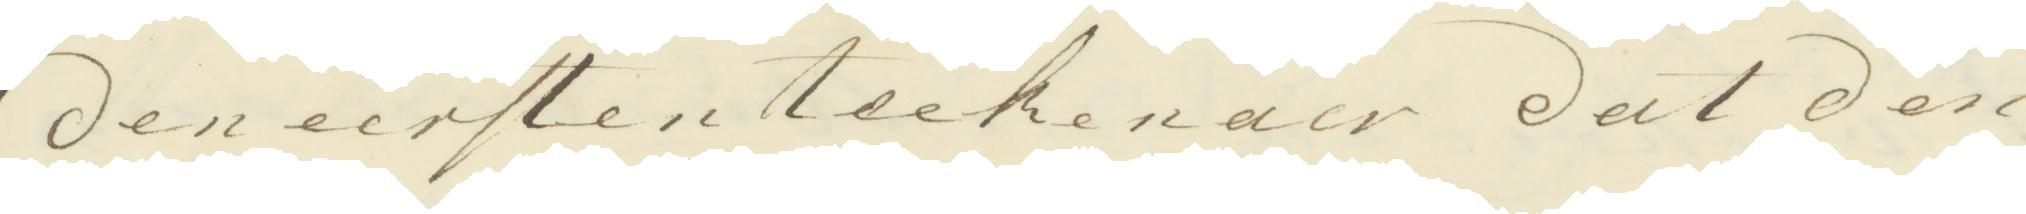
den eersten teekenaer dat den
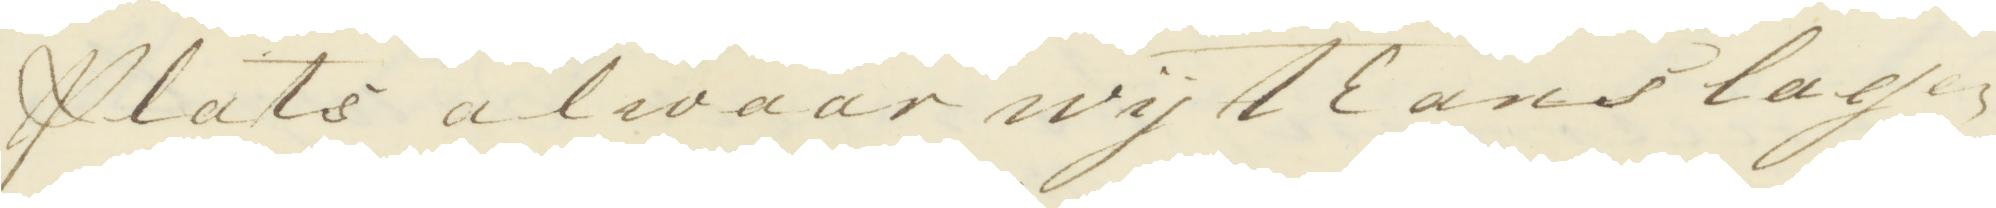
plats alwaar wij thans lagen
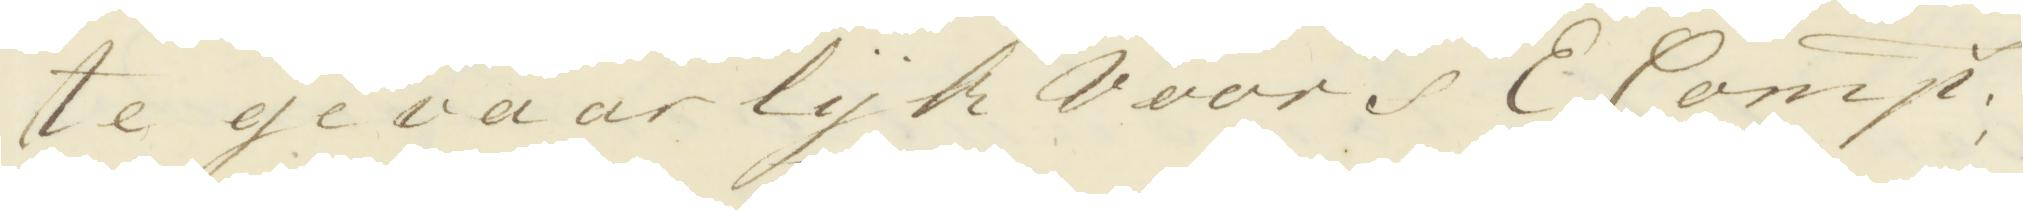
te gevaarlijk voor 's E Comp:s
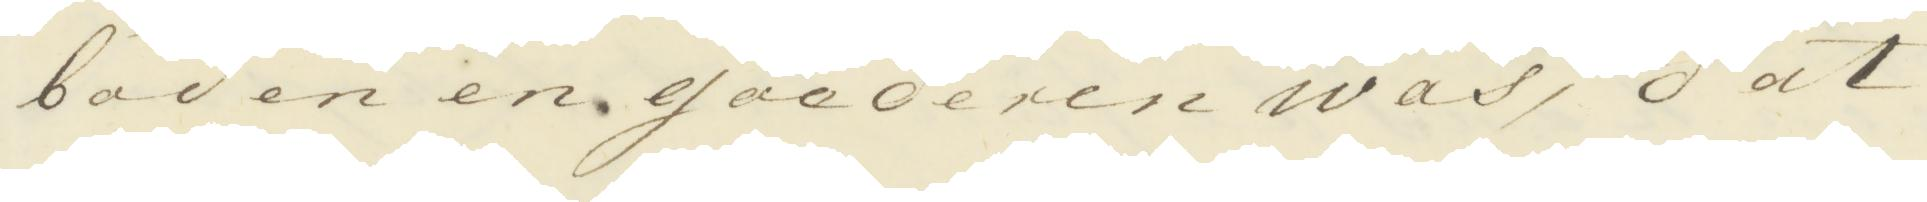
baden en goederen was, dat
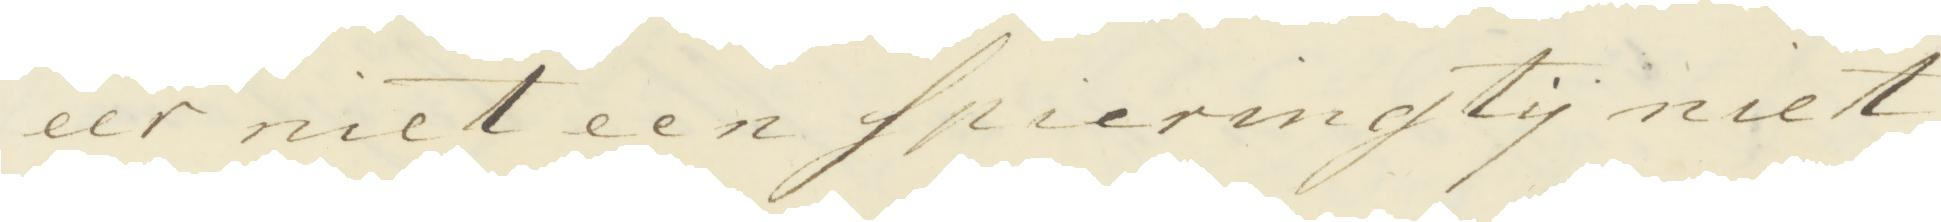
eer niet een spieringtij niet
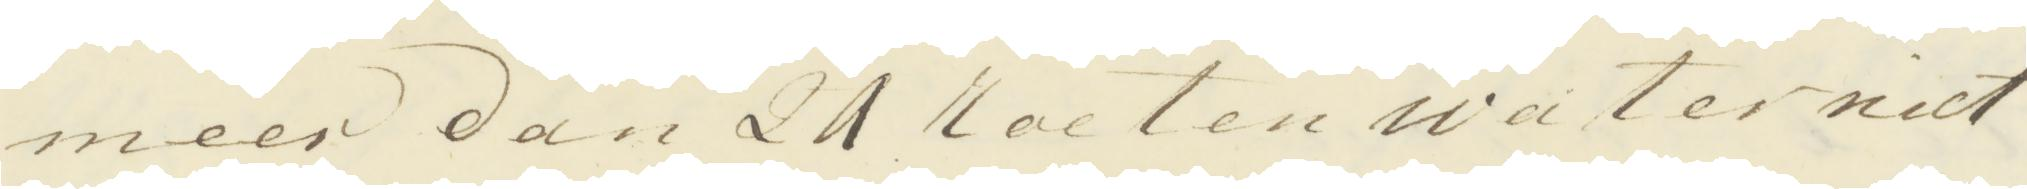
meer dan 24 roeten water niet
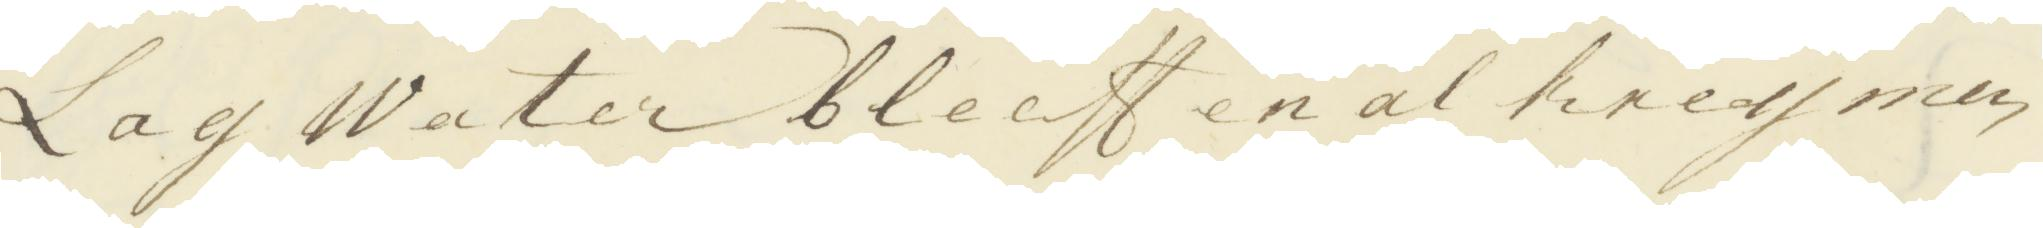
Lag water bleeff en al kreeg men
